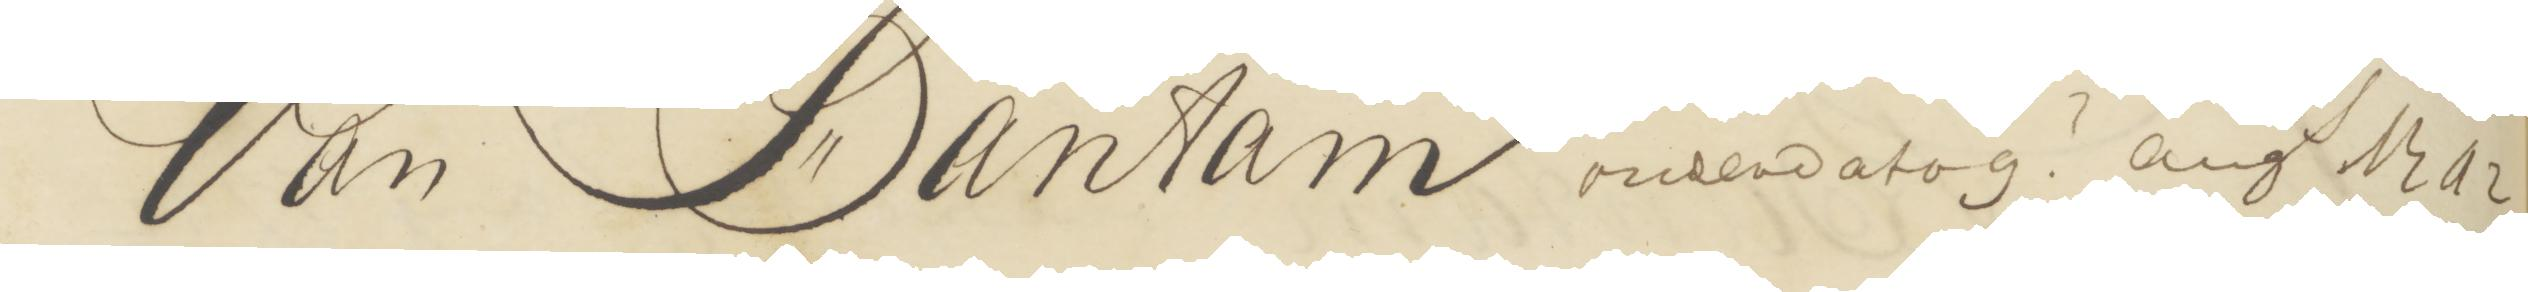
Van Bantam onderdato 9.' augs 1742
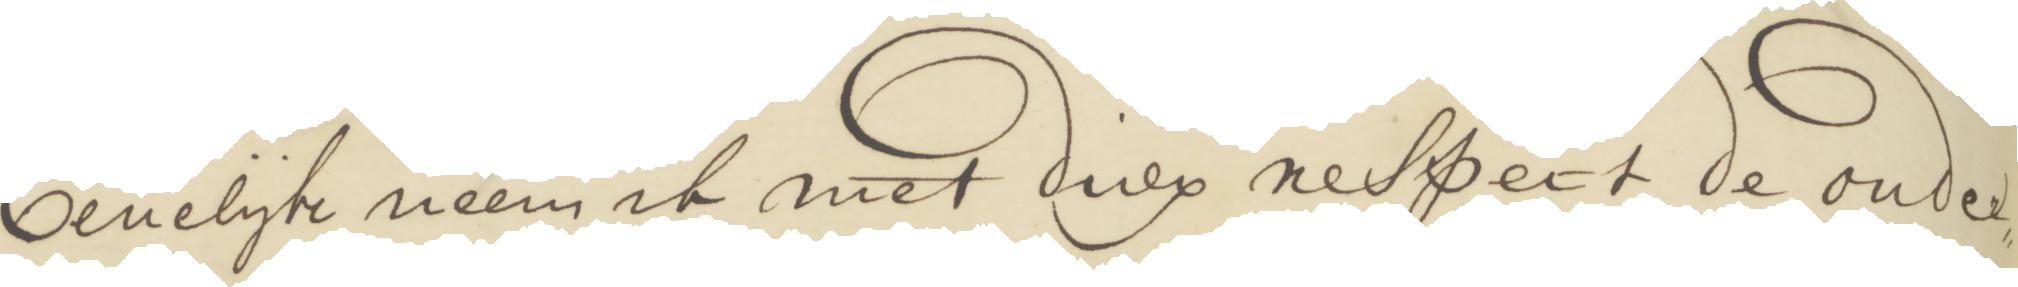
Eenelijk neem ik met diep respect de onder„
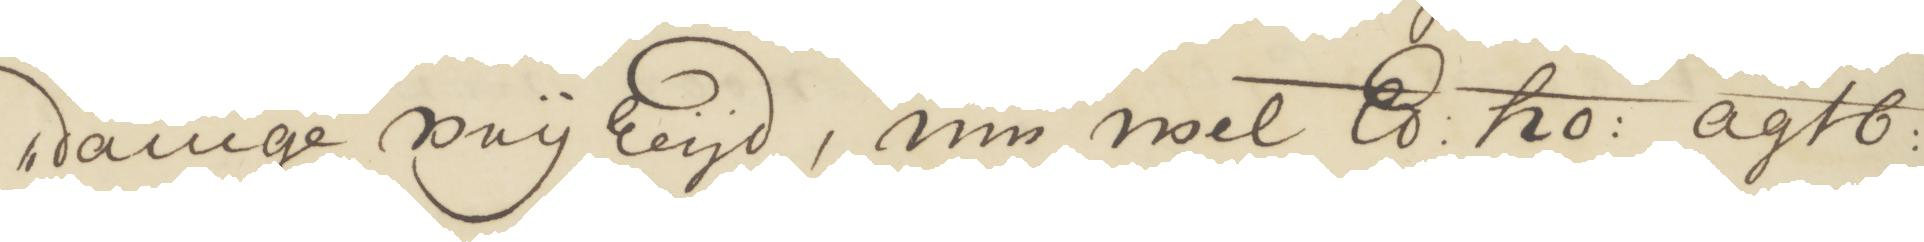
„danige vrijheijd, uw wel Ed: ho: agtb:
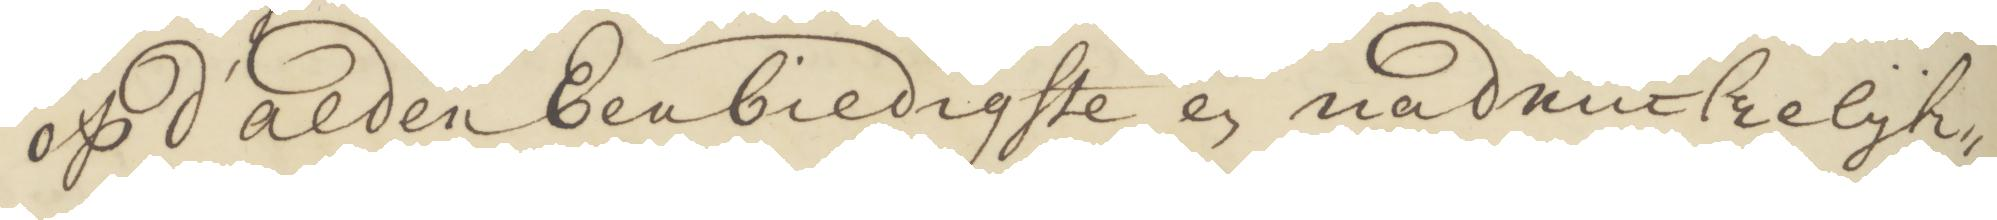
op d’ alder Eerbiedigste en nadruckelijk„
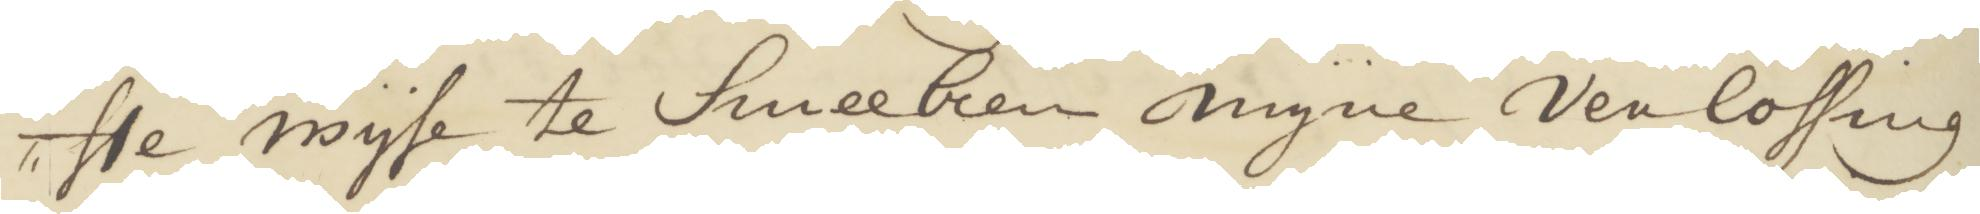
„ste wijse te smeeken mijne verlossing
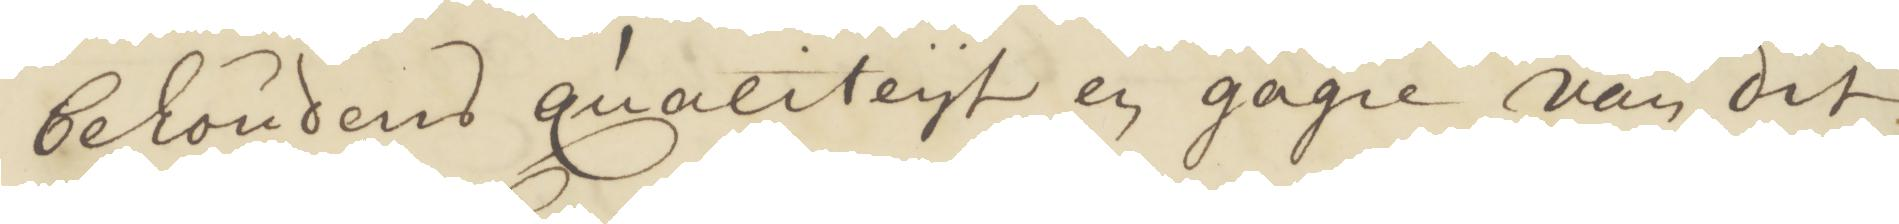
behoudens qualiteijt en gagie van dit
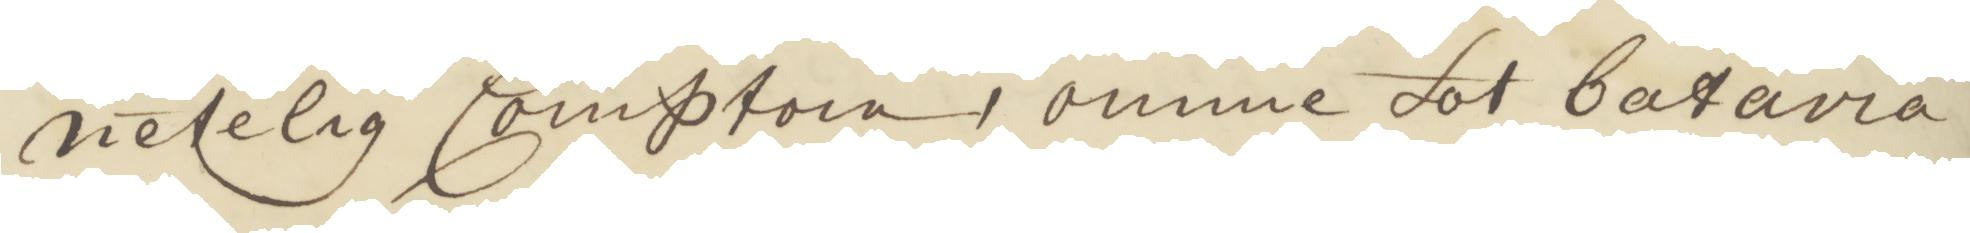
netelig Comptoir, omme tot batavia
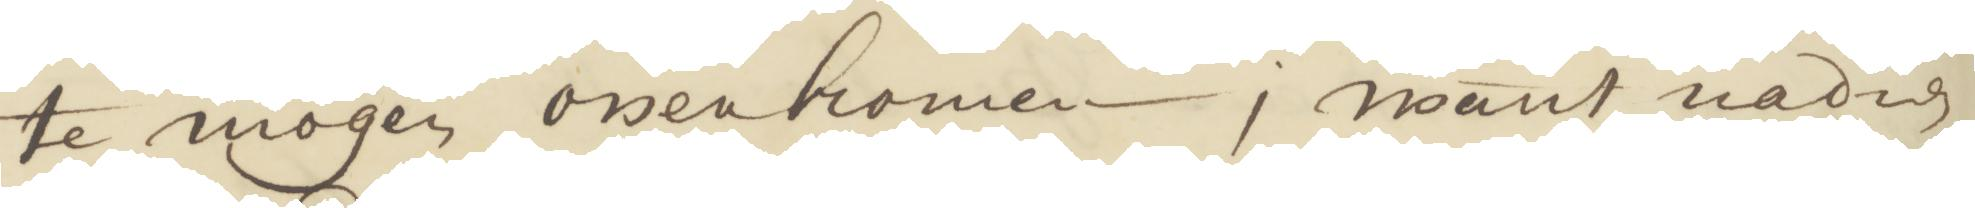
te mogen overkomen; want nadien
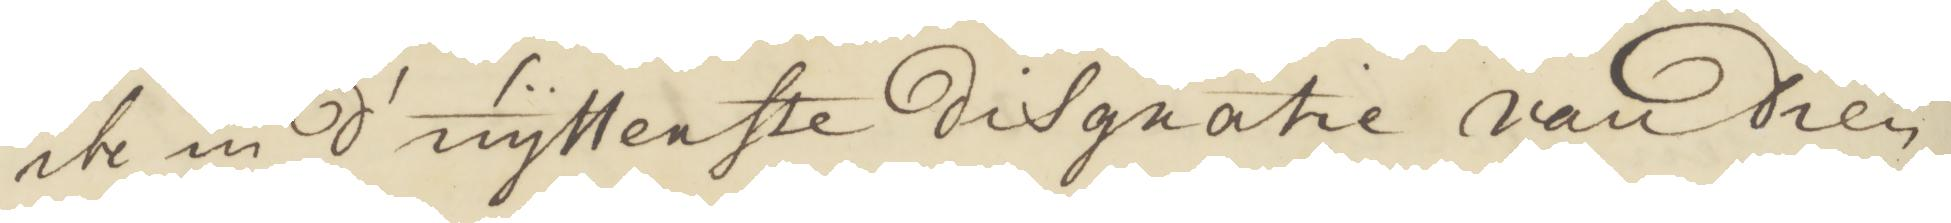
ik in d’ uijtterste disgratie van dien
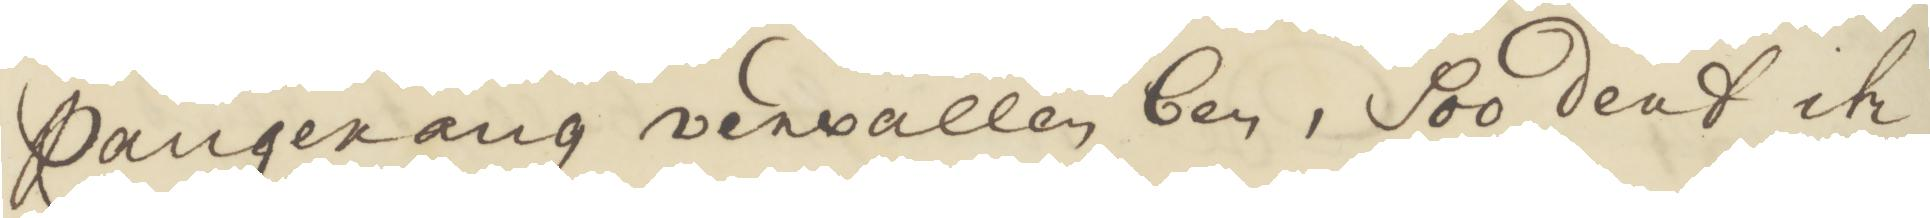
pangerang vervallen ben, soo derf ik
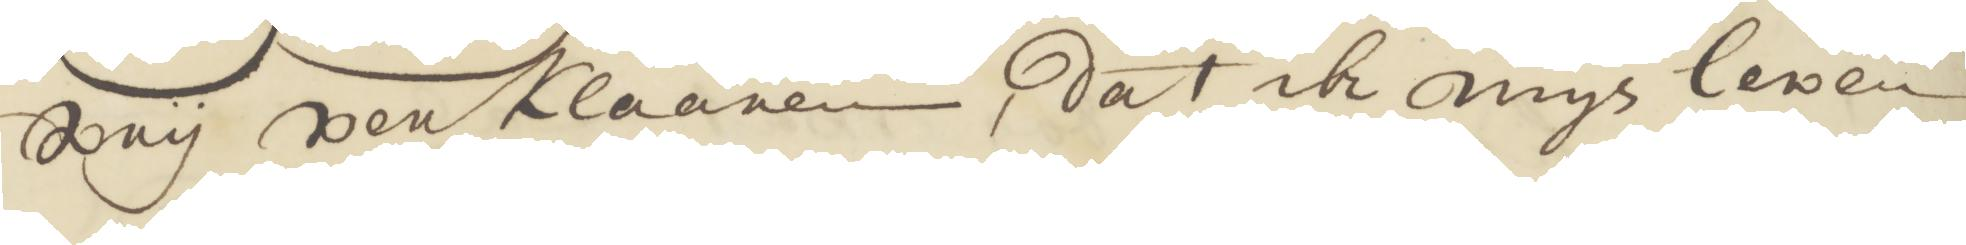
vrij verklaaren, dat ik mijn leven
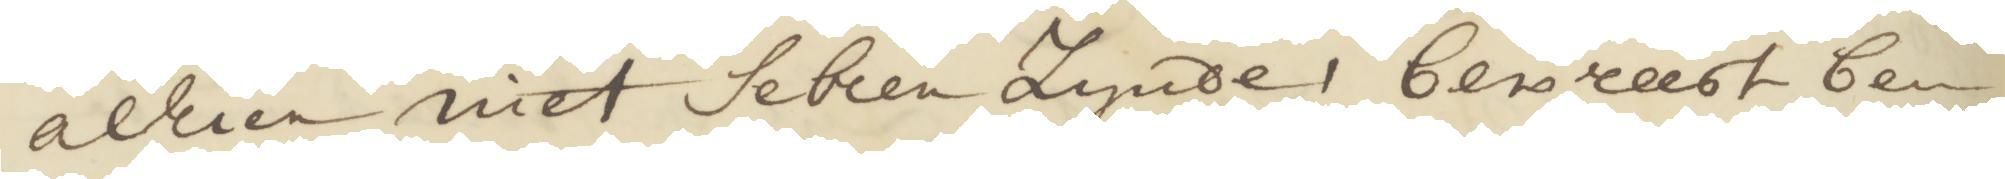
alhier niet seker Zijnde, bevreest ben
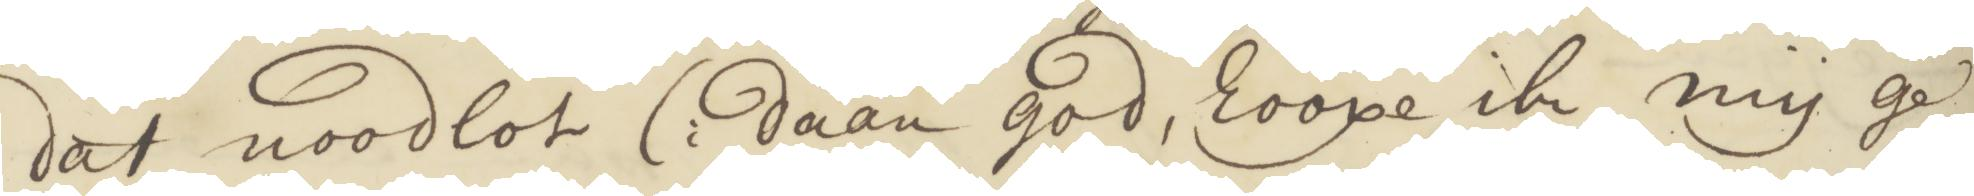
dat noodlot (:daar god, hoope ik mij ge
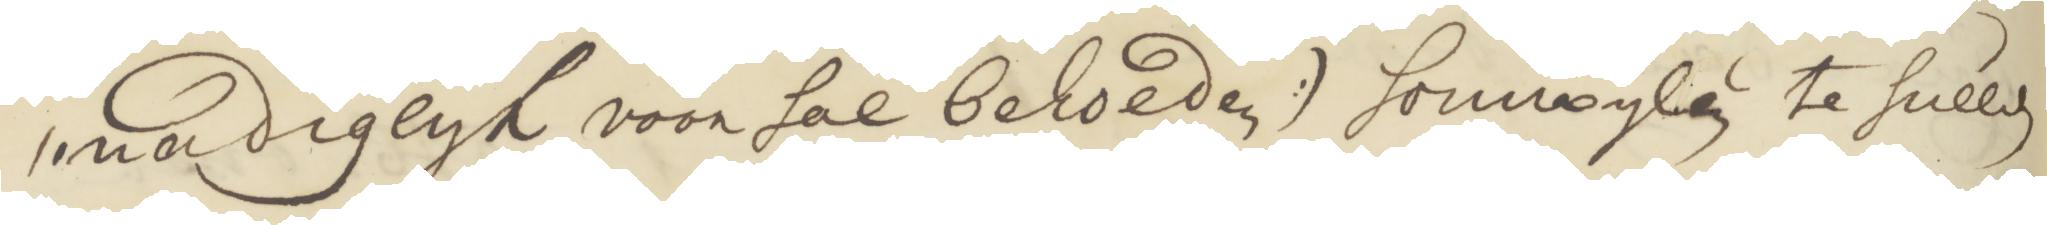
„nadiglijk voor sal behoeden:) somwijlen te sullen
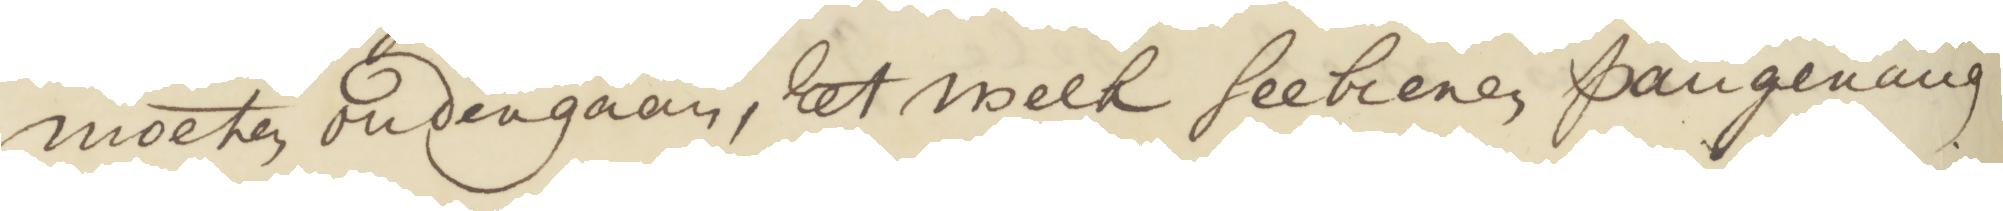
moeten ondergaan, het welk seekeren pangerang
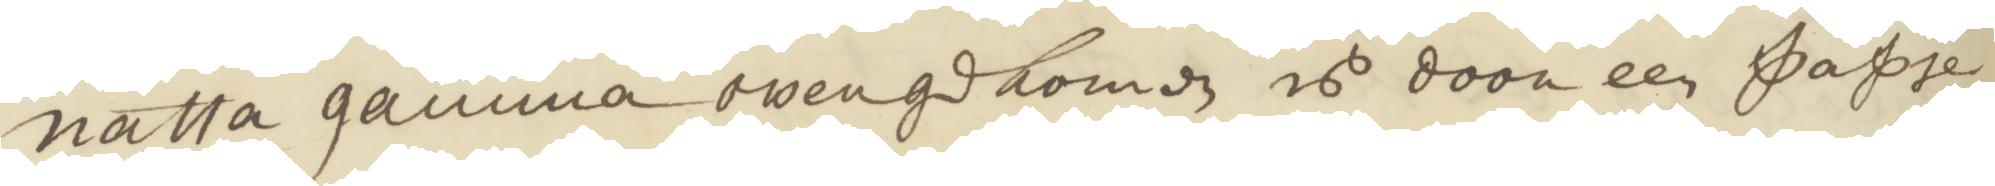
natta gamma overgekomen is door een papje
